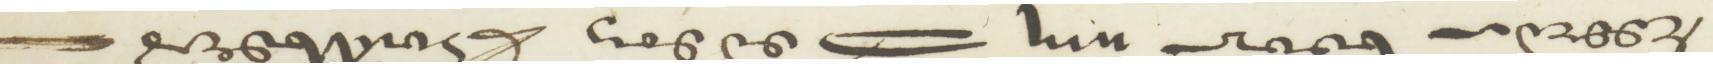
reerden voor mij Zedery Boutters
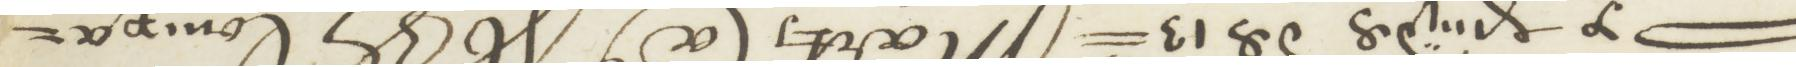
Op huijden den 13=en Marti @o 1637 Compar
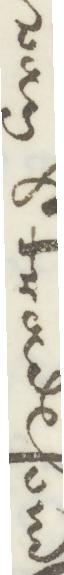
van Straelsond
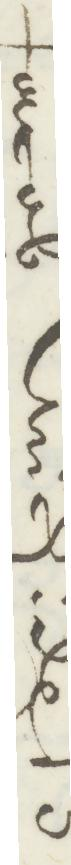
Jacob Michiels
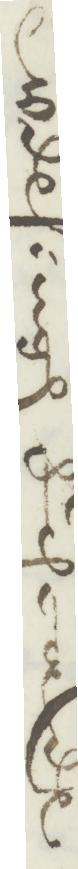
Welsingh Fiscael
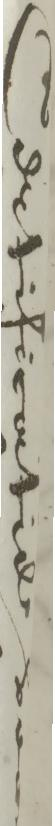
Certificatie van
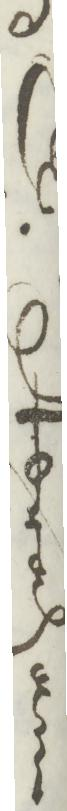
d E. Abraham
